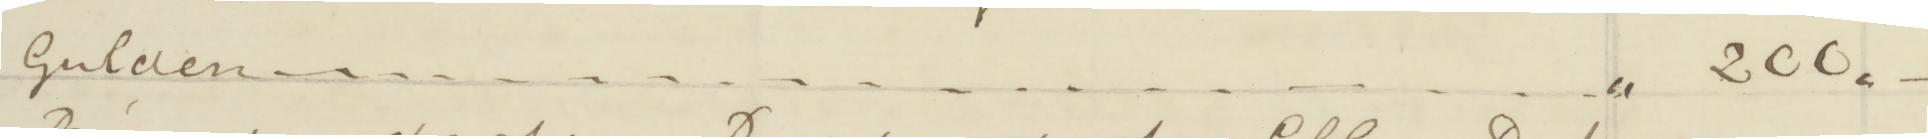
Gulden - - - - - - - - - - - - - - - - - - - - „ 200„ —
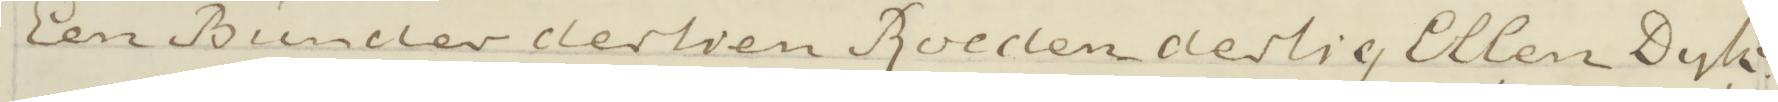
Een Bunder dertien Roeden dertig Ellen Dyk
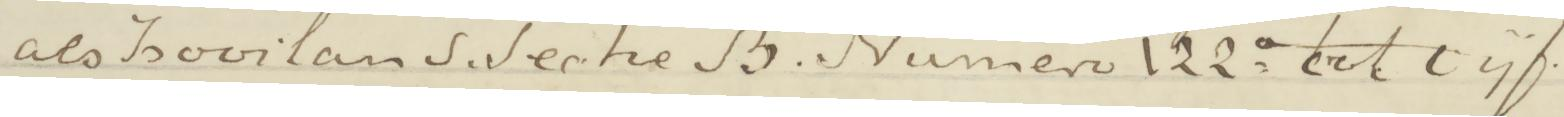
als hooiland. Sectie B. Numero 122= tot vijf
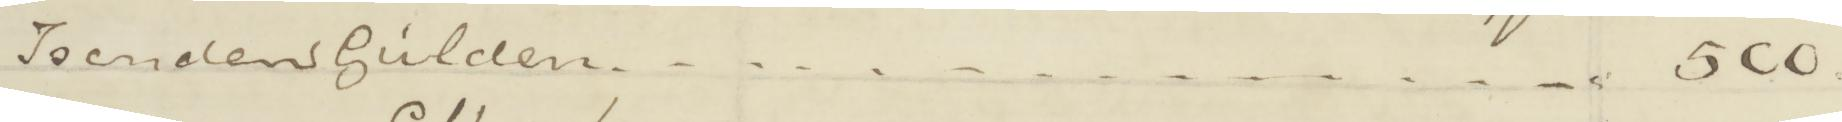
honderd Gulden - - - - - - - - - - - - - - „ 500
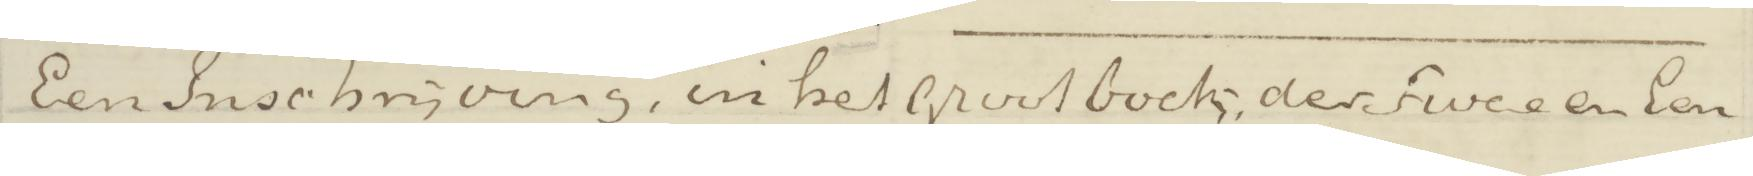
Een Inschrijving, in het Grootboek, der Twee en Een
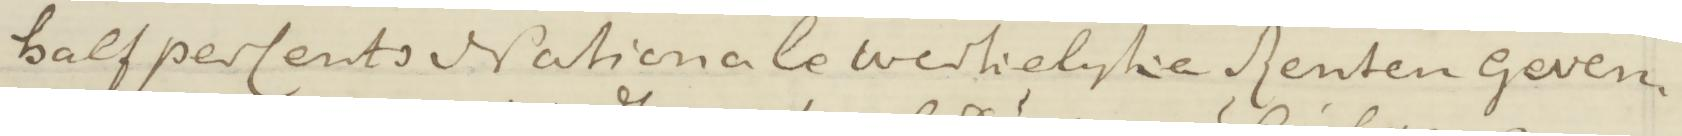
half percents Nationale werkelyke Renten geven:
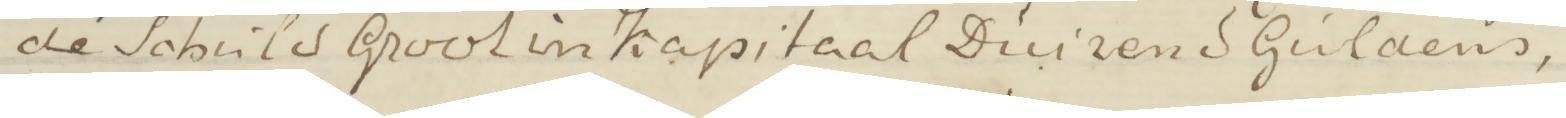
de schuld Groot in Kapitaal Duizend Guldens,
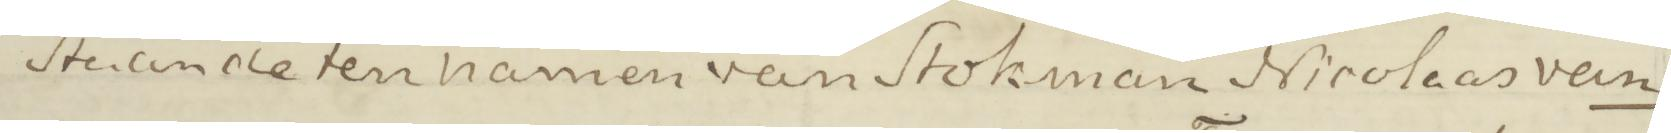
staande ten namen van Stokman Nicolaas van
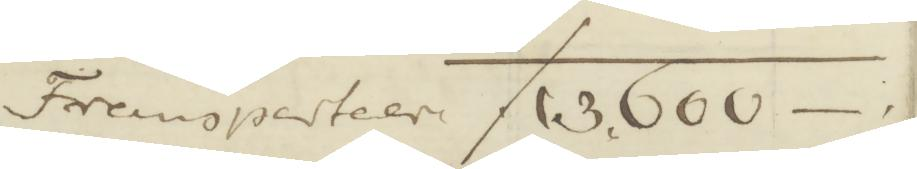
Transporteer ƒ13,600 — ,
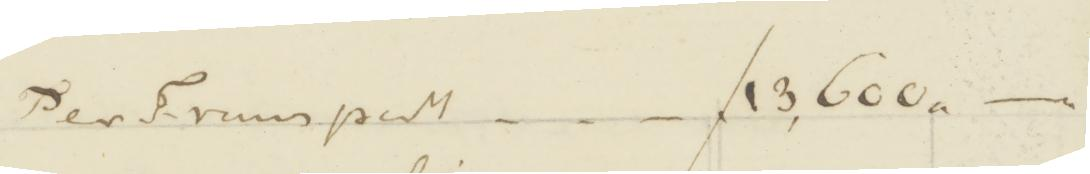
Per Transport - - - ƒ13,600„ —„
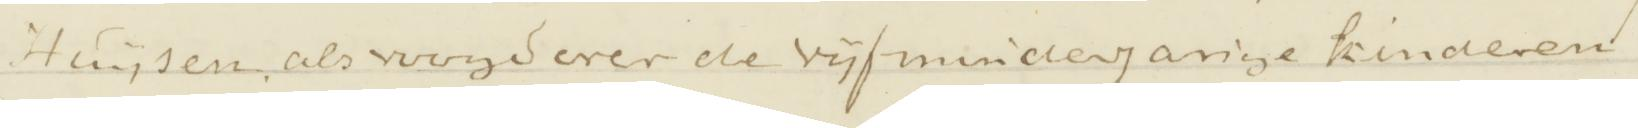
Huijsen, als voogd over de vijf minderjarige kinderen
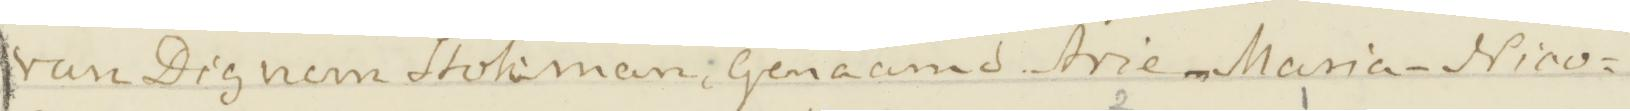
van Dignom Stokman, Genaamd Arie – Maria – Nico=
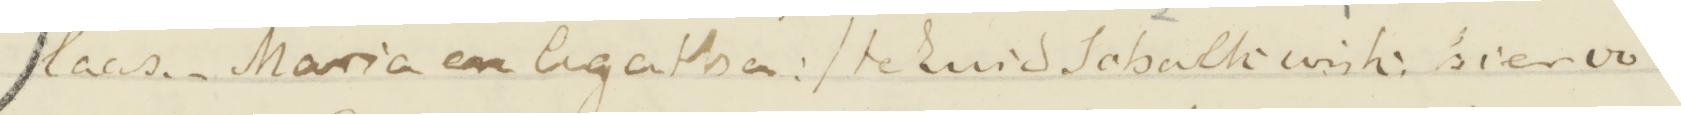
laas. – Maria en Agatha :/ te Zuid Schalkwijk, hier vo=
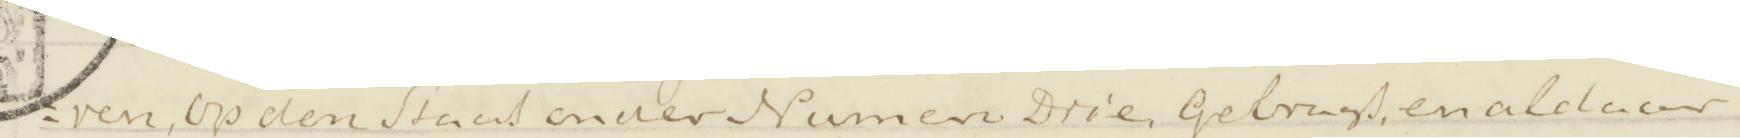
ren, op den Staat onder Numero Drie, Gebragt, en aldaar
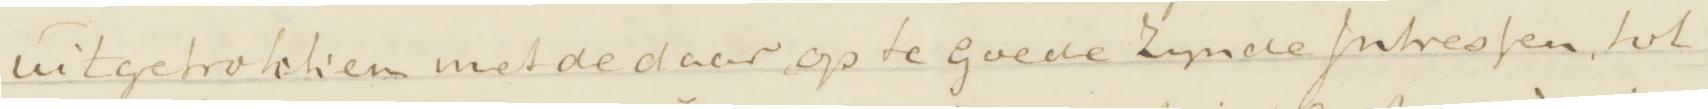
uitgetrokken met de daar op te goede Zynde jntressen, tot
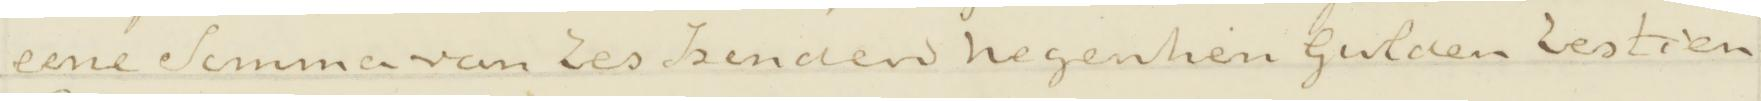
eene somma van Zes honderd negentien Gulden zestien
